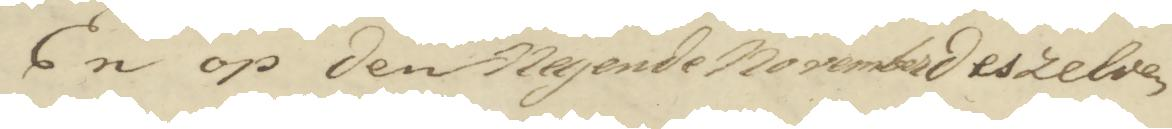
En op den Negende November deszelven
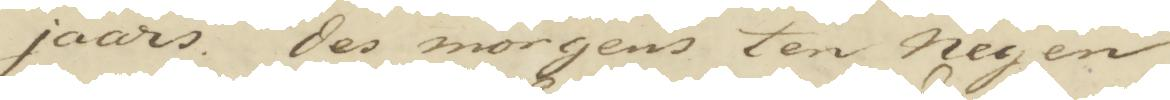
jaars. des morgens ten negen
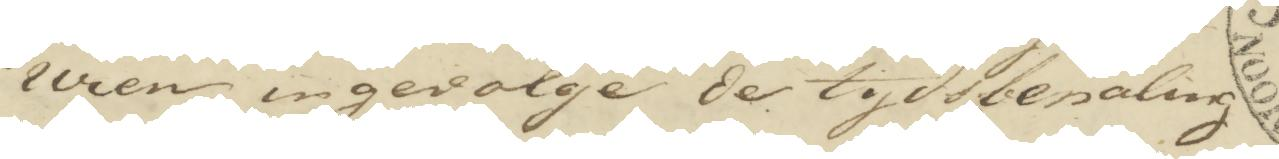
uren ingevolge de tijdsbepaling
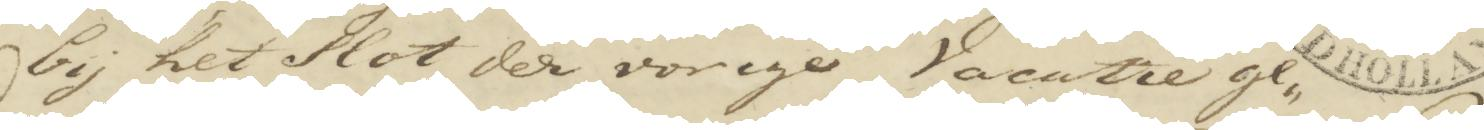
bij het slot der vorige Vacatie ge„
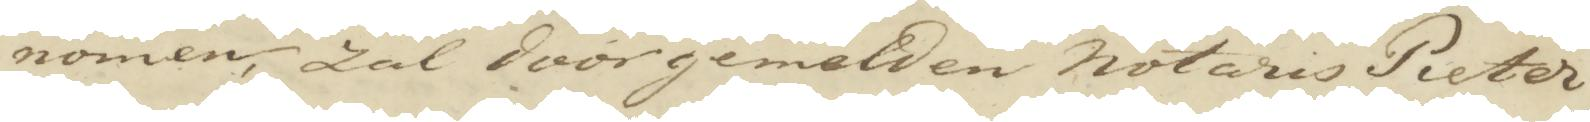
nomen, zal door gemelden notaris Pieter
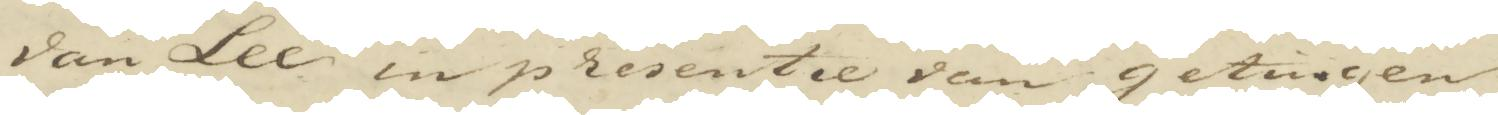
van Lee in presentie van getuigen
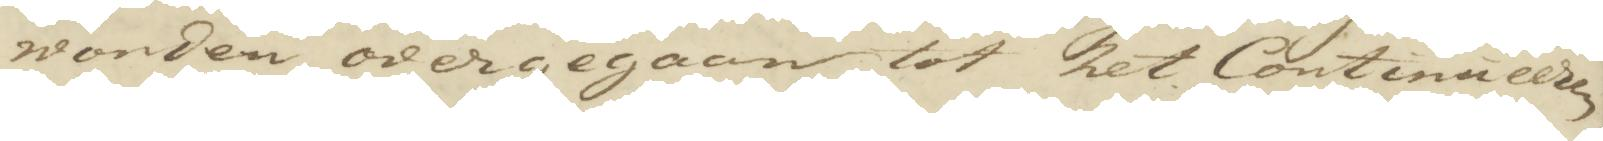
worden overgegaan tot het Continueeren
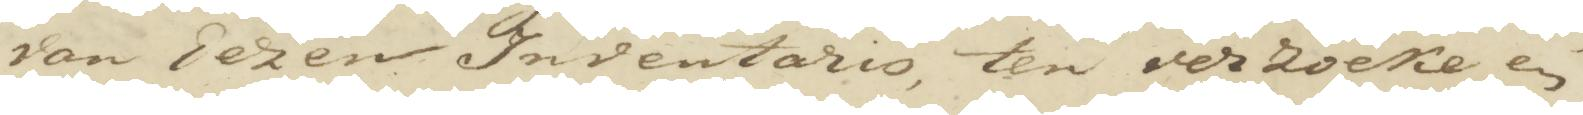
van dezen Inventaris, ten verzoeke en
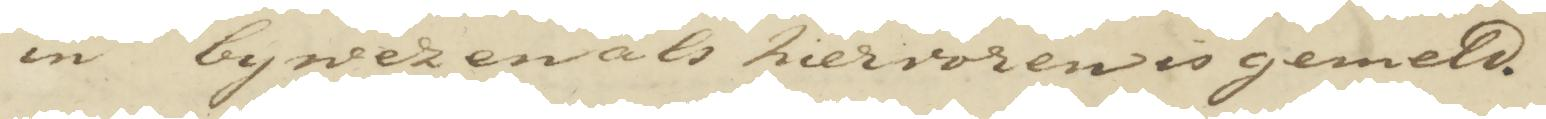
in bijwezen als hiervoren is gemeld.
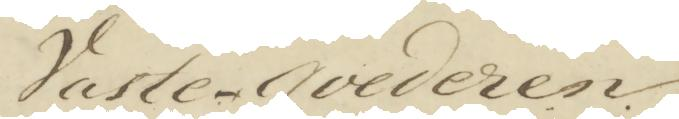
Vaste-Goederen.
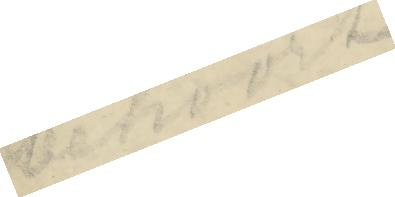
behoort
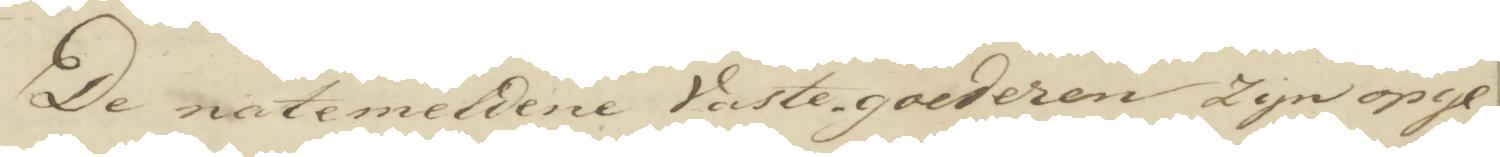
De natemeldene Vaste-goederen zijn opge
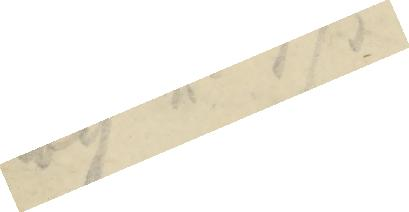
bij no 175
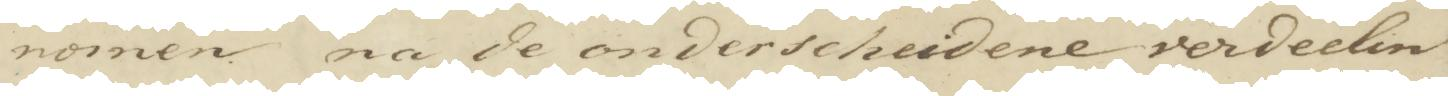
nomen na de onderscheidene verdeelin
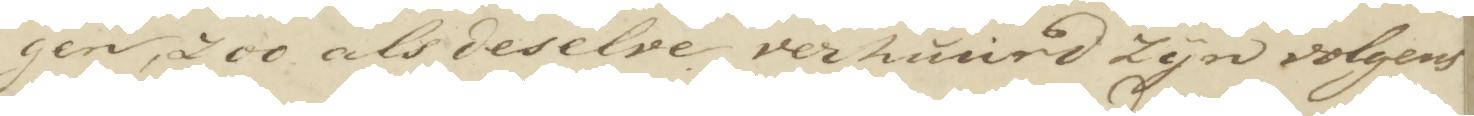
gen, zoo als deselve verhuurd zijn volgens
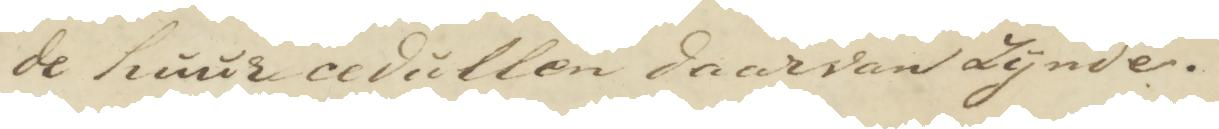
de huur-cedullen daarvan Zijnde.
